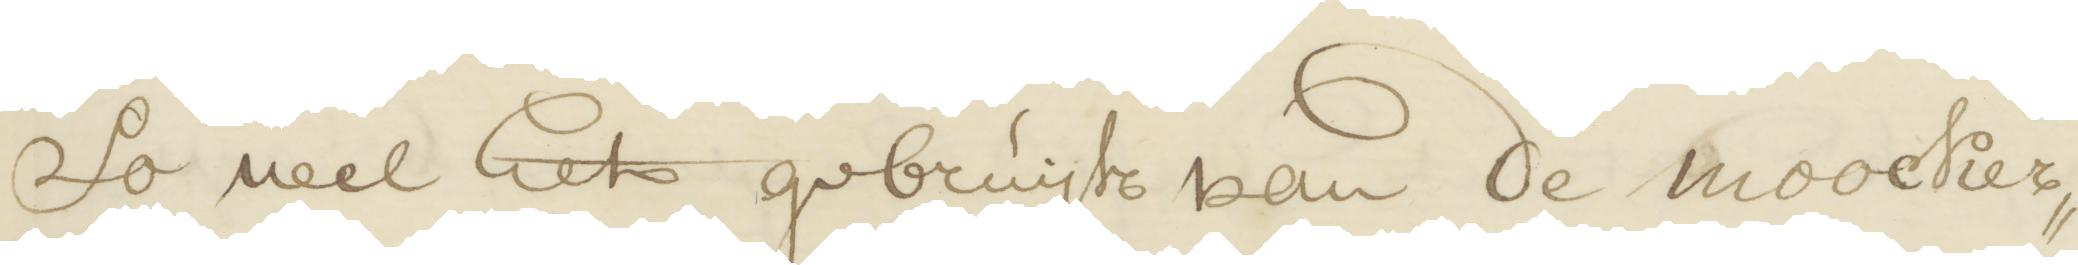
So veel het gebruijk van de moocker„
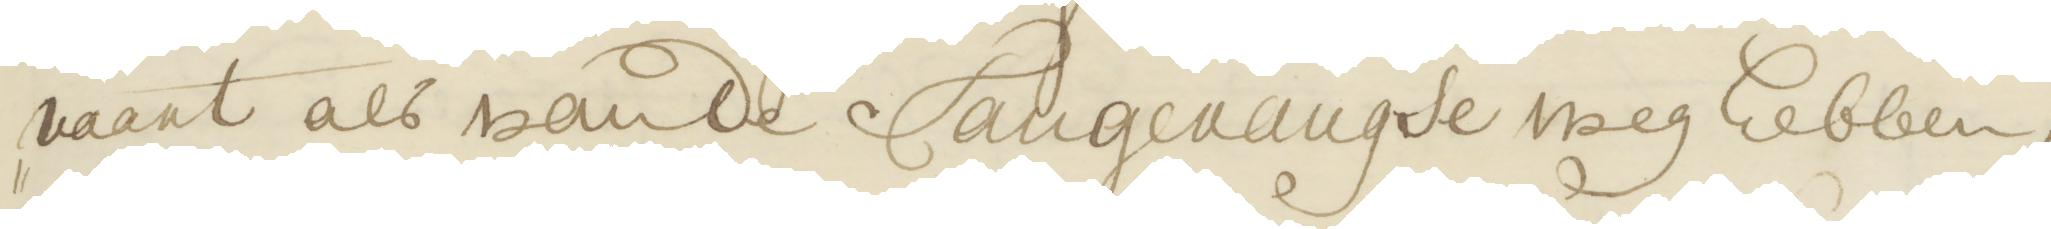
vaart als van de Pangerangse weg hebben
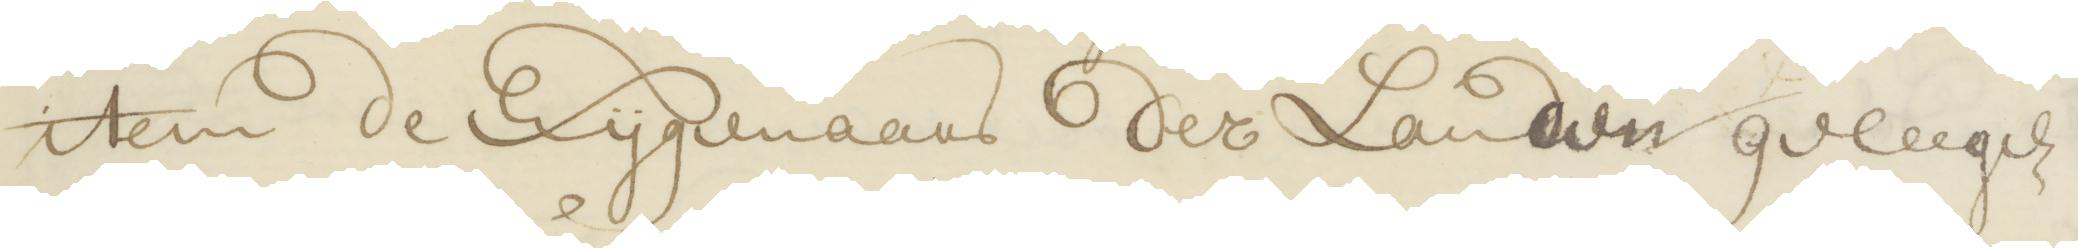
item de Eijgenaars der Landen geleegen
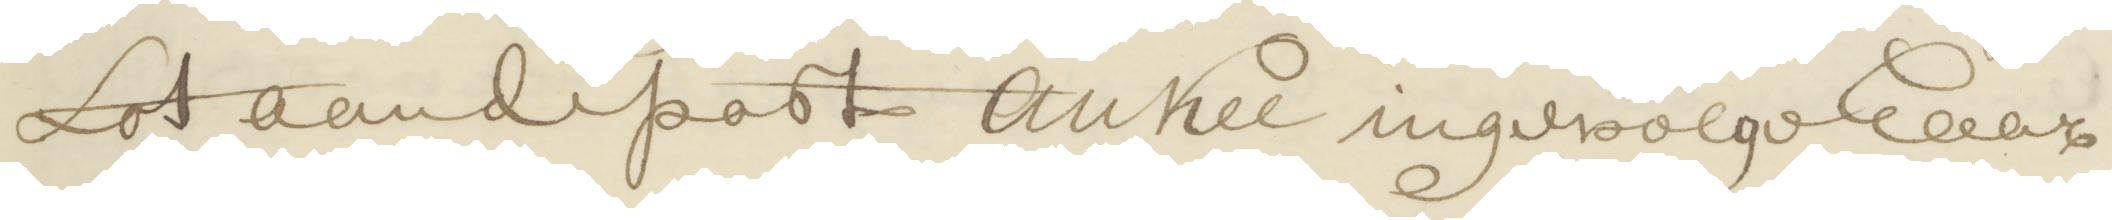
tot aan de post ankee ingevolge haar
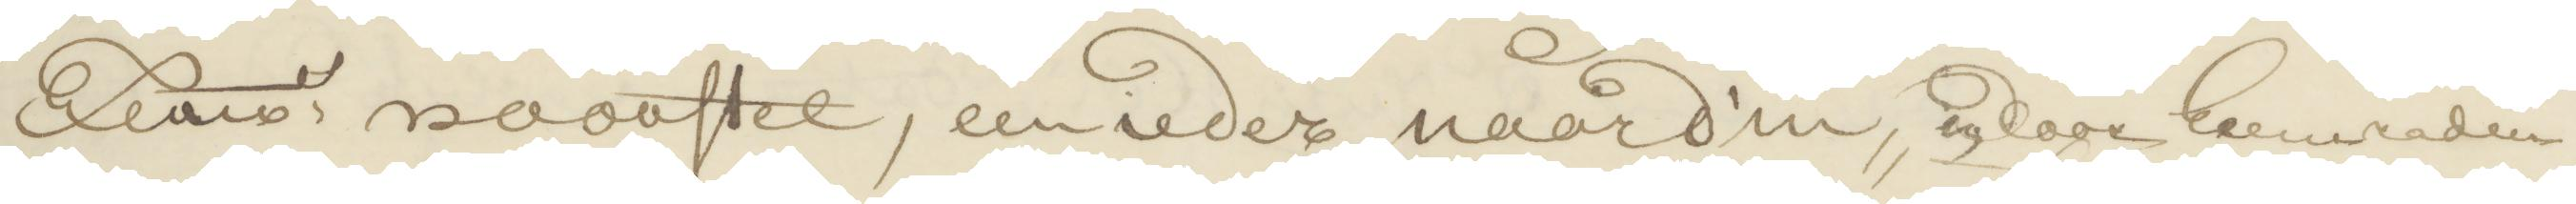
Eerw:s voorstel, en ieder naar d'in„ en door heemraden
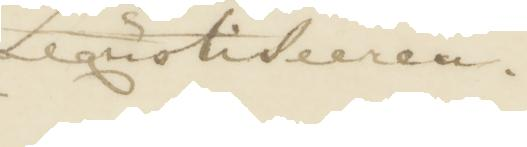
te quotiseeren.
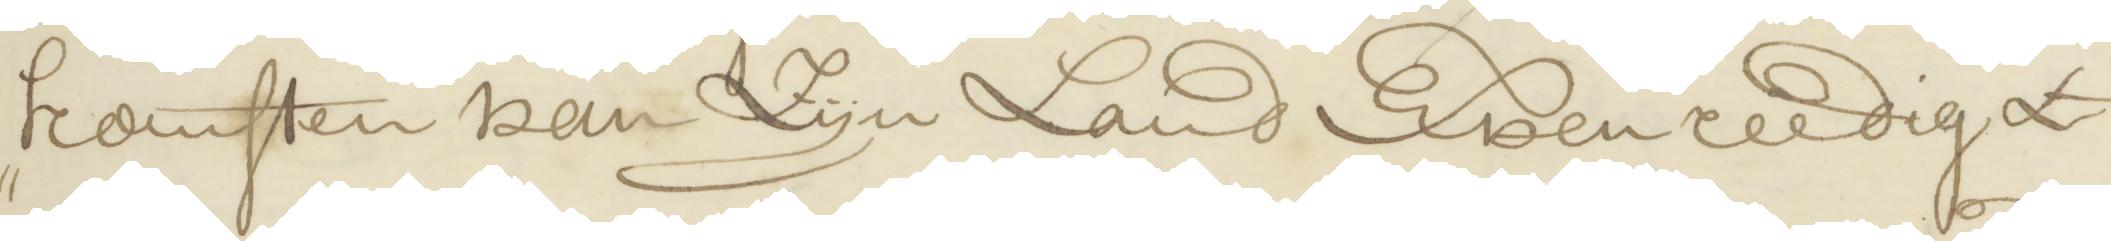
komsten van zijn land Evenreedig t
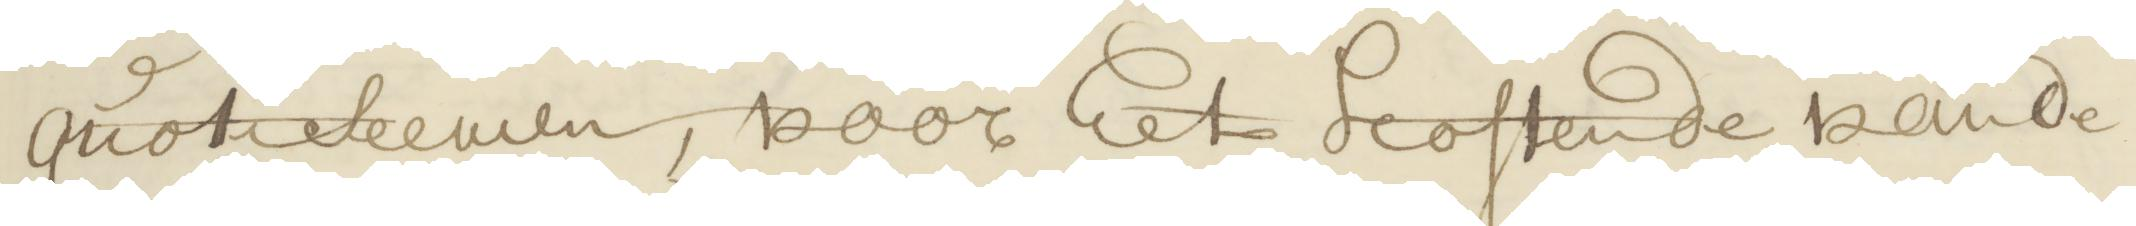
quotiseeren, voor het kostende van de
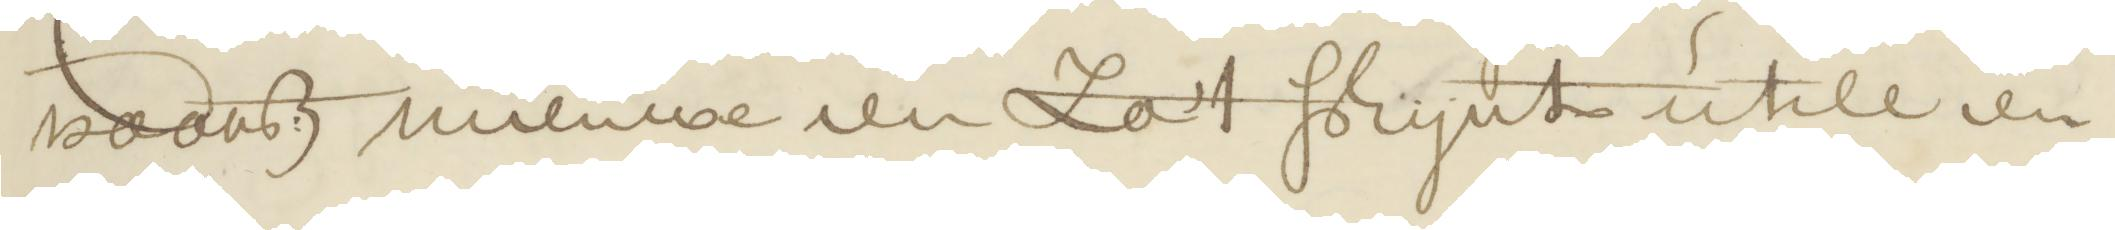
voors:z nieuwe en zo't schijnt utile en
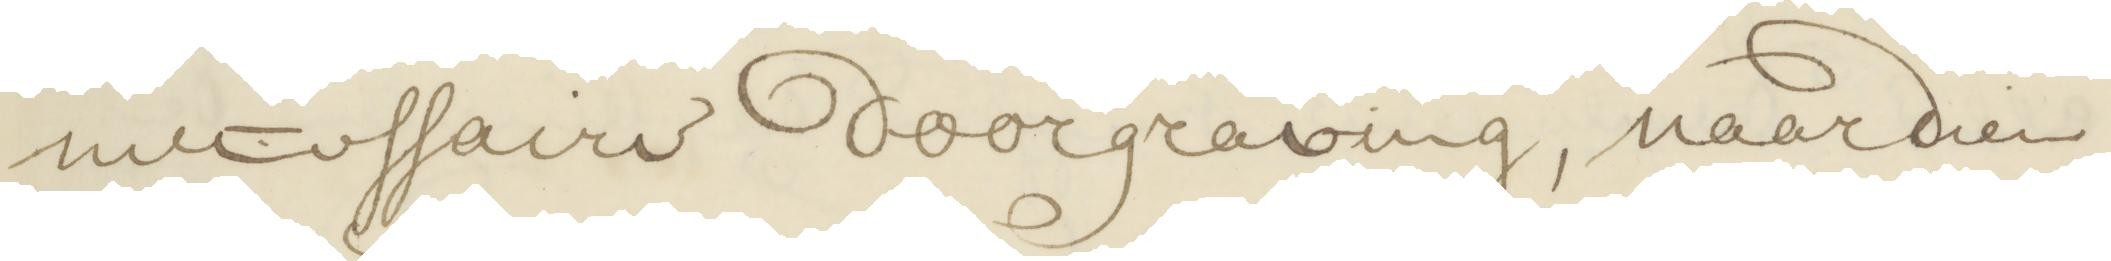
necessaire doorgraving, naar dien
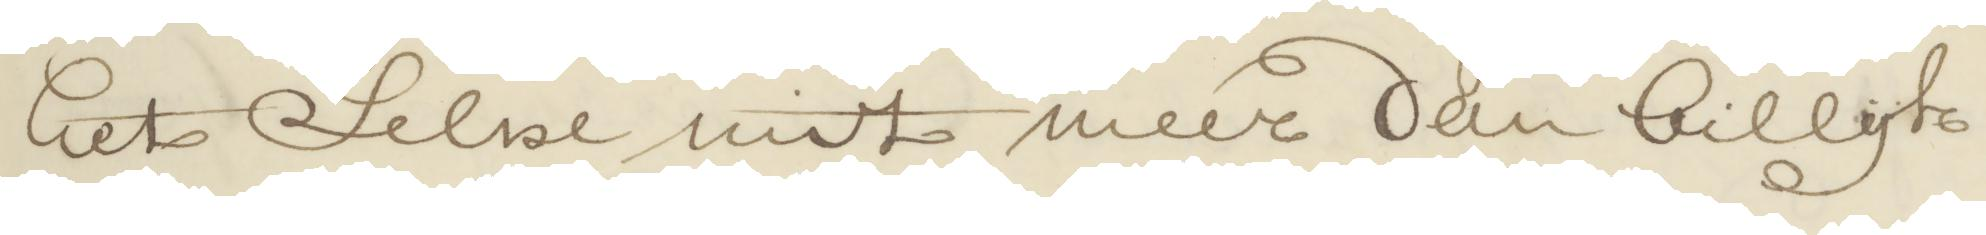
het selve niet meer dan billijk
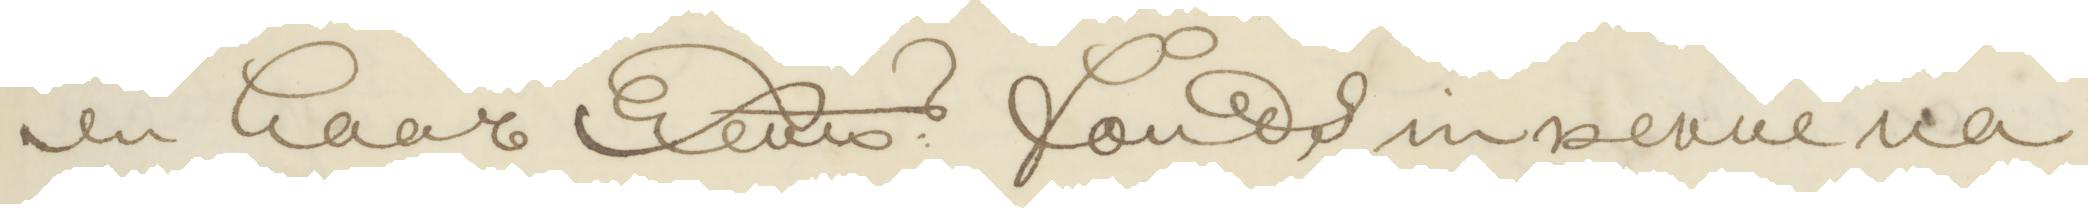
en haar Eerw:s fonds in verre na
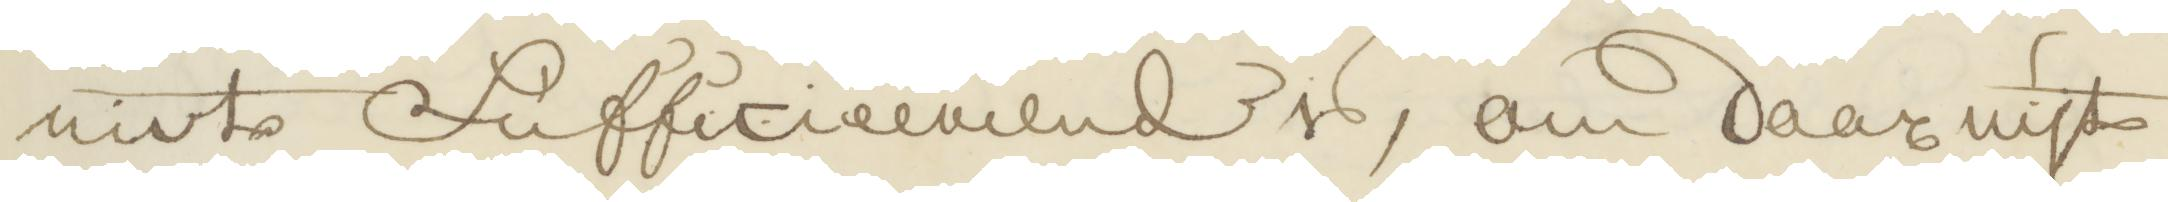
niet sufficieerende is, om daar uijt
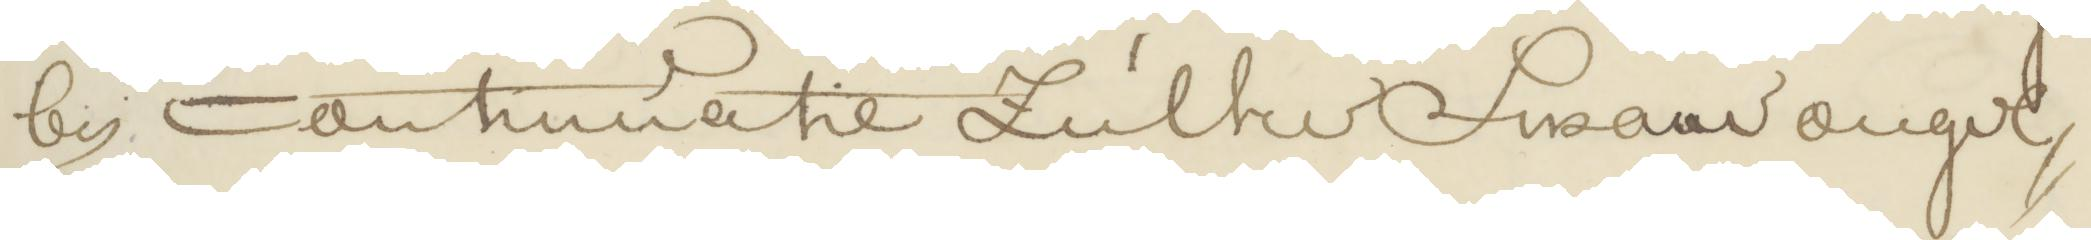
bij continuatie zulke Sware ongel„
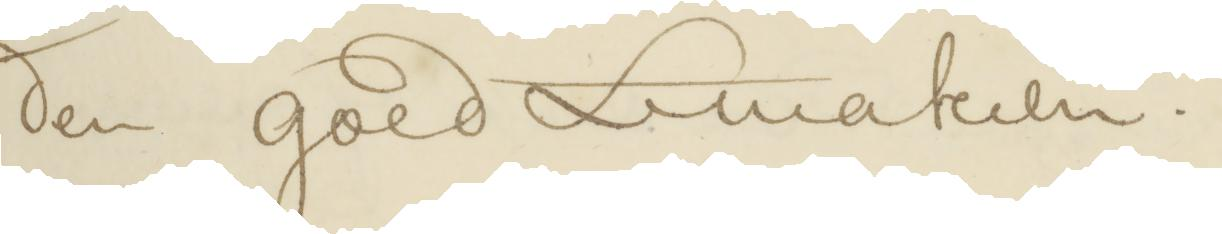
den goed temaken.
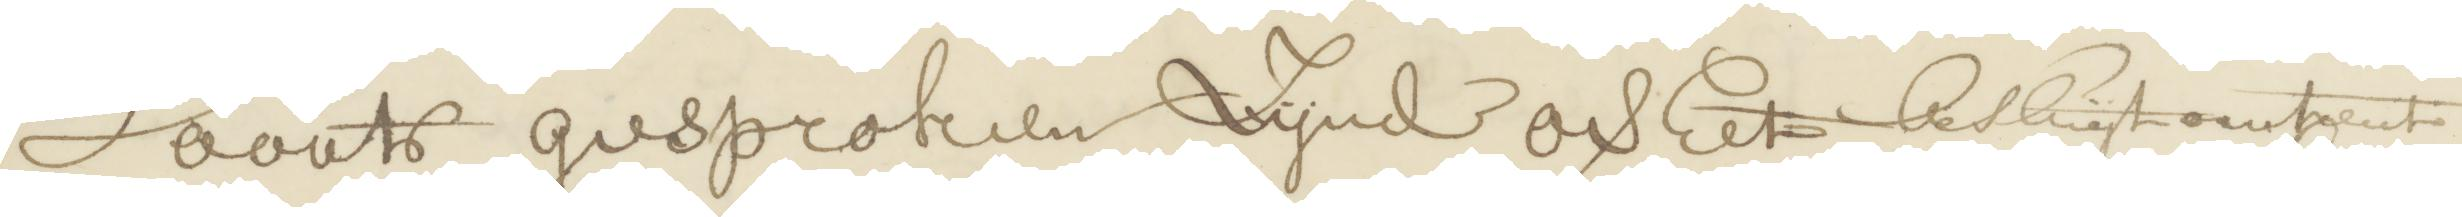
Voorts gesproken zijnde over het besluijt omtrent
